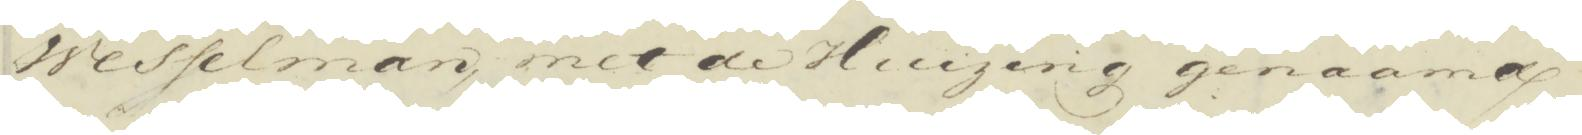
Wesselman, met de Huizing genaamd
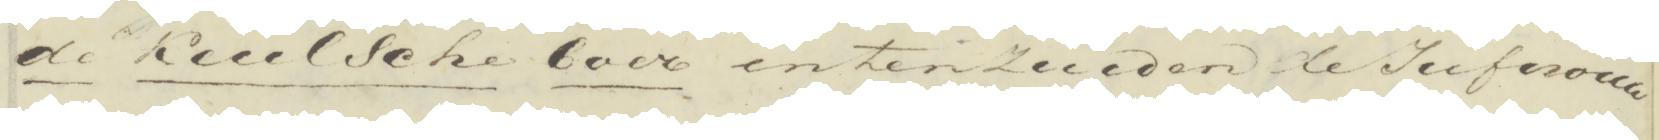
de Keulsche boer en ten zuiden de Iufvrouw
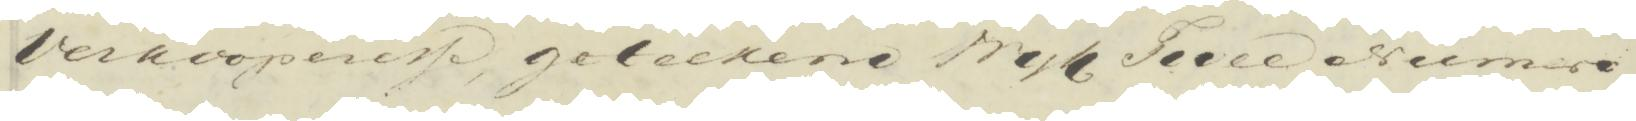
verkooperesse, geteekend Wijk Twee Numero
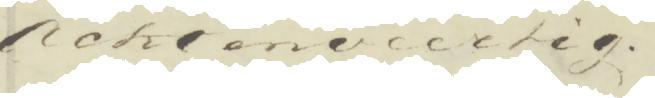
Achten veertig.
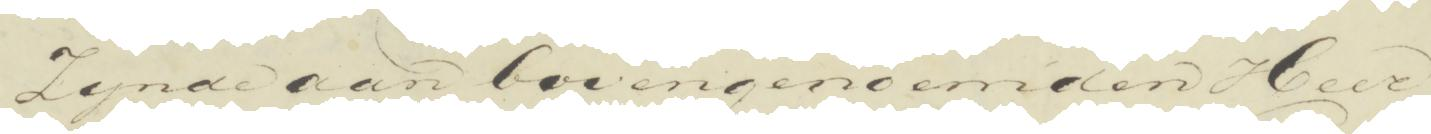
Zynde aan bovengenoemden Heer
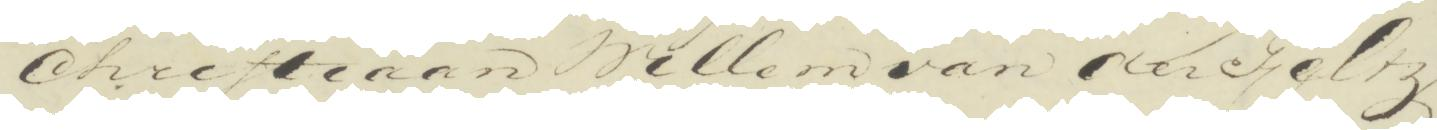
Christiaan Willem van der Feltz
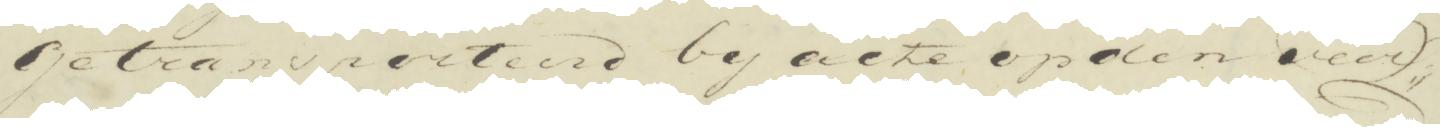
getransporteerd bij acte op den veer„
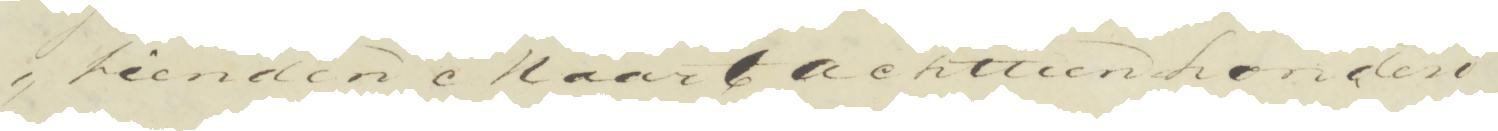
„tienden Maart achttienhonderd
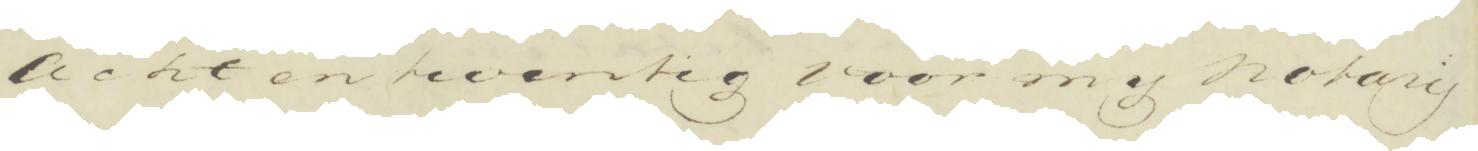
acht en twintig voor my Notaris
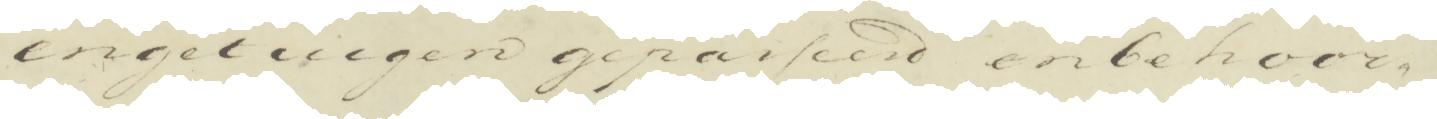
en getuigen gepasseerd en behoor„
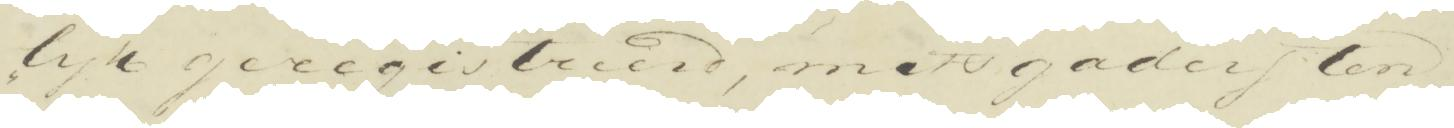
„lyk geregistreerd, mitsgaders ten
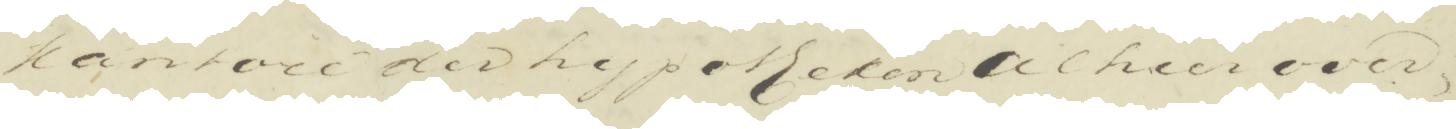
kantore der hypotheken alhier over
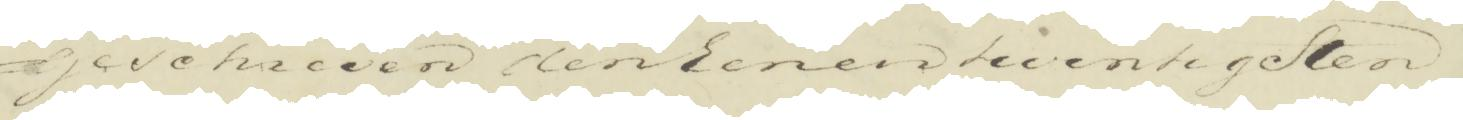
=geschreven den Eenen twintigsten
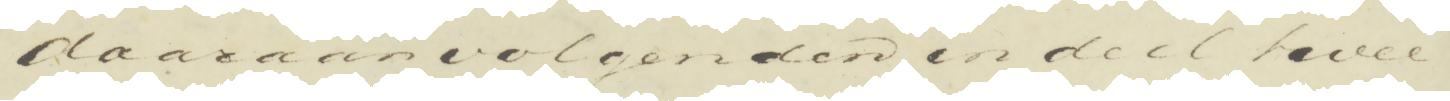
daaraan volgenden, in deel twee
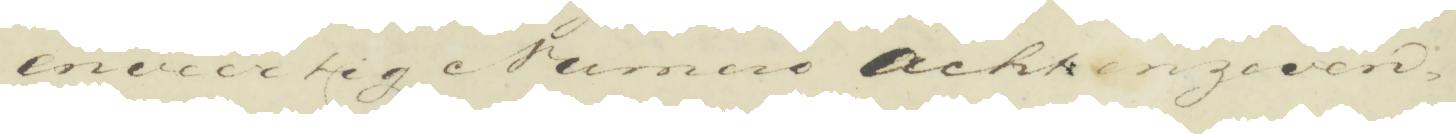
en veertig Numero Achtenzeven„
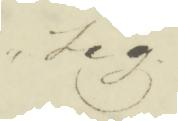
„tig.
